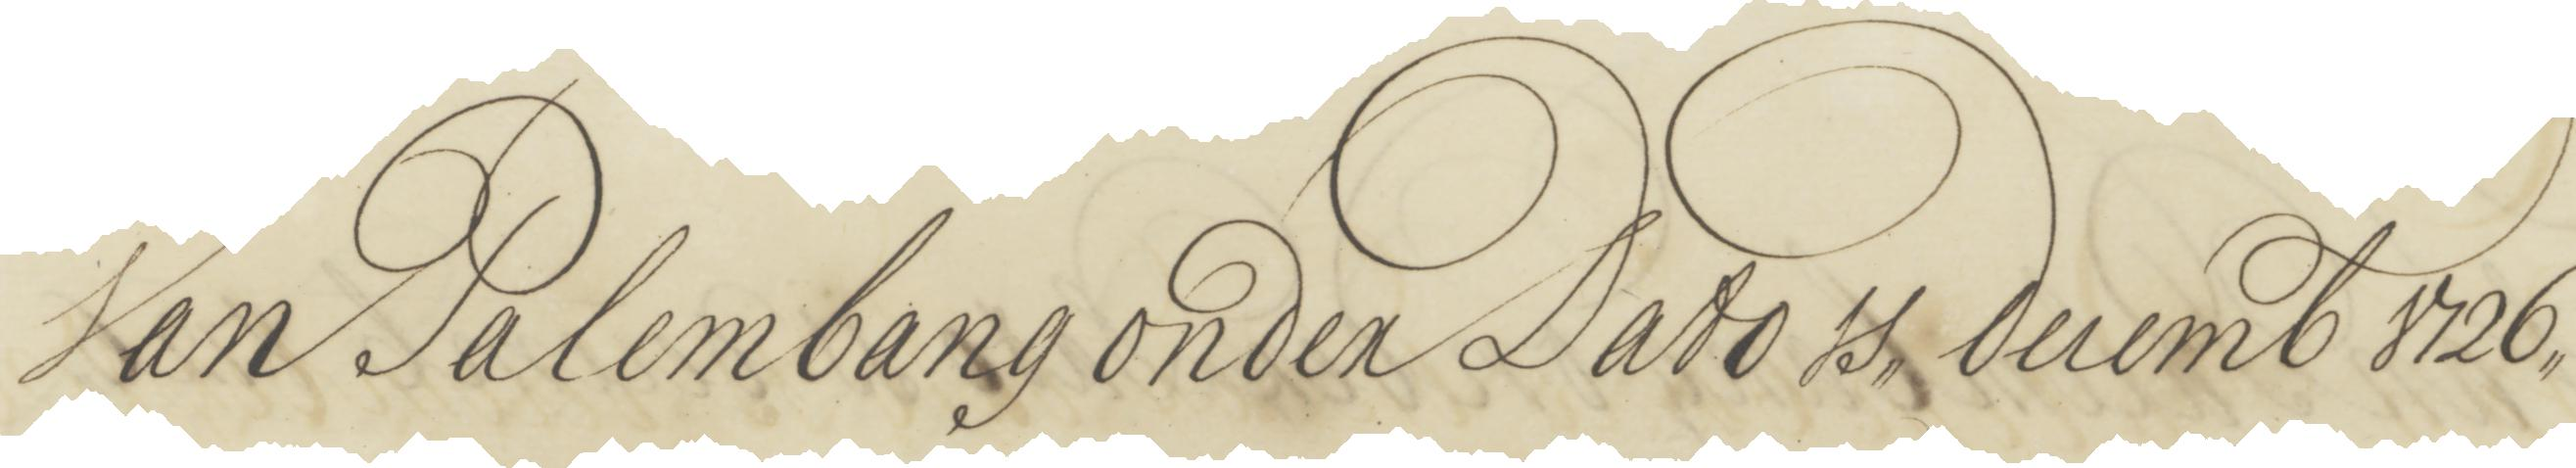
Van Palembang onder Dato 11„ decemb 1726„
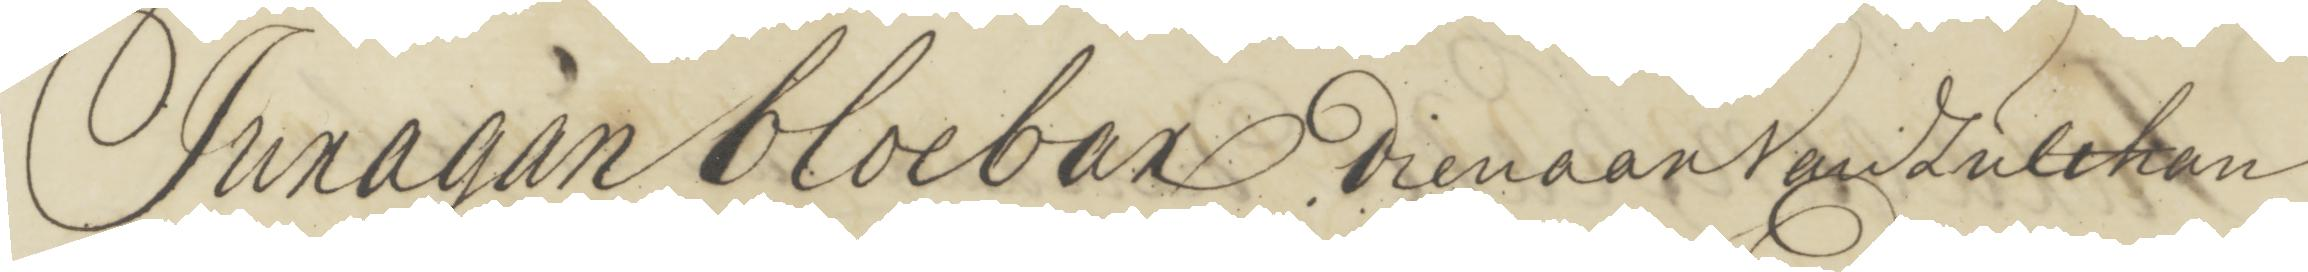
Juragan bloebar dienaar van Zulthan
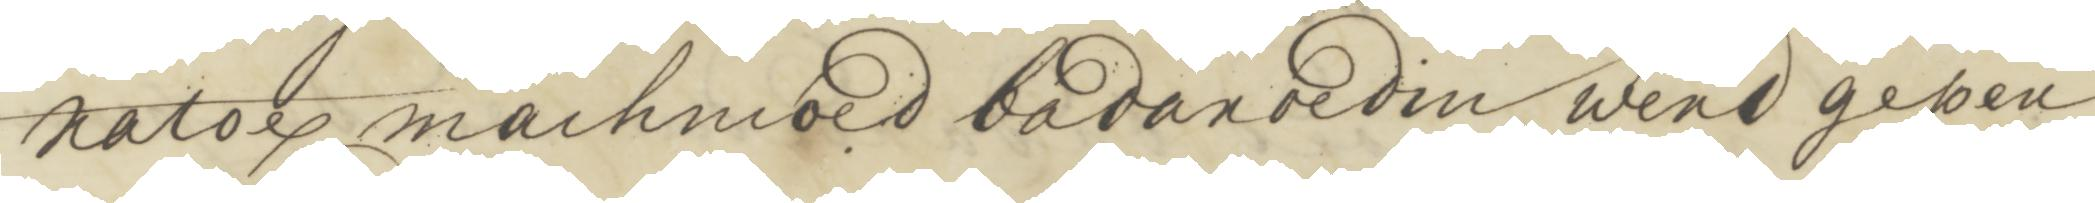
ratoe machmoed badaroedin werd geper
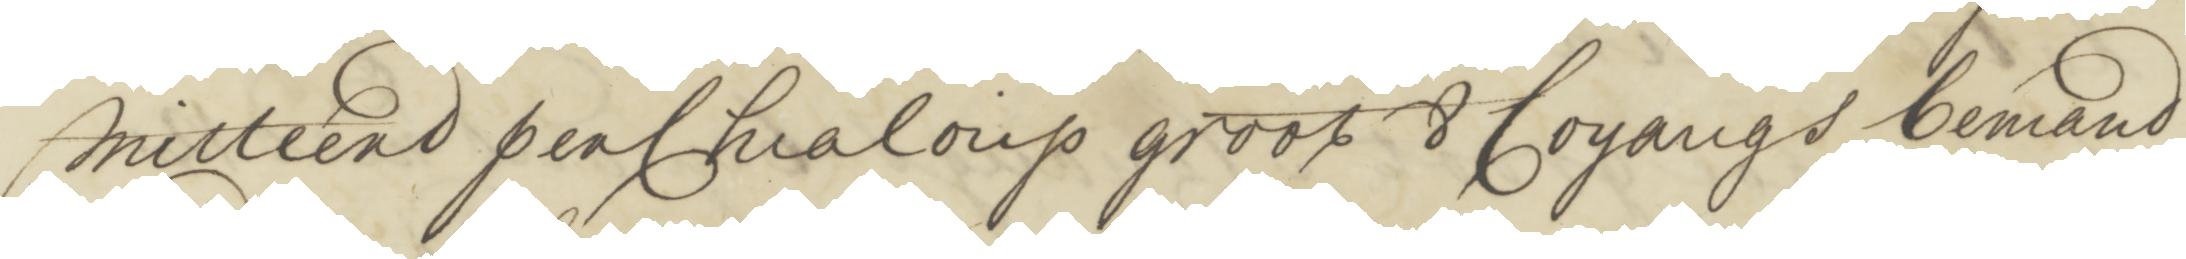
mitteerd per Chialoup groot 8 Coyangs bemand
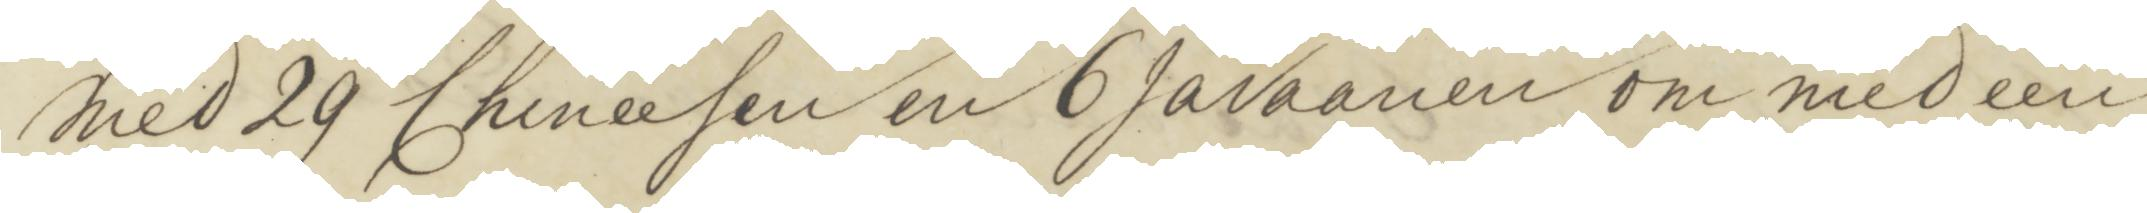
med 29 Chineesen en 6 Javaanen om med een
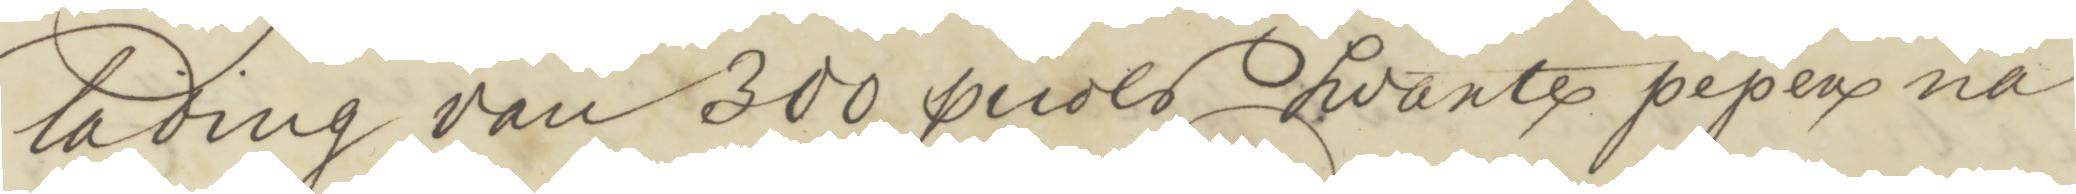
lading van 300 picols swarte peper na
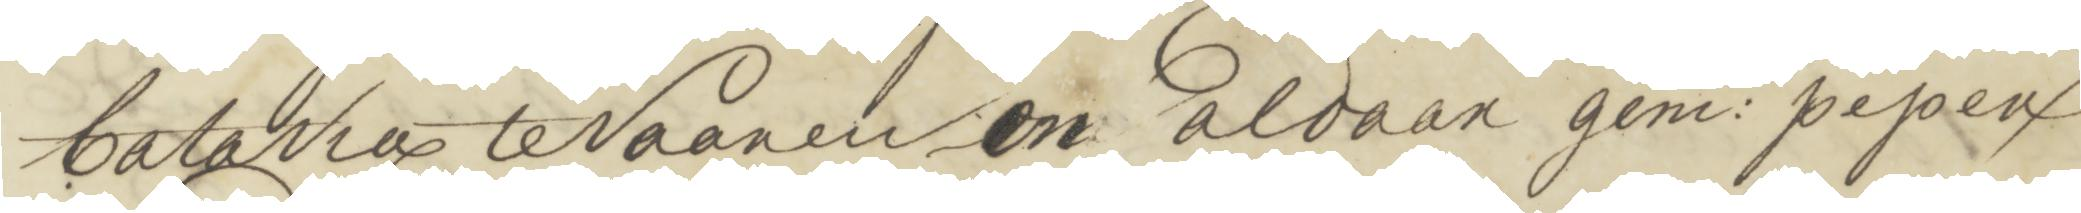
batavia tevaaren en aldaar gem: peper
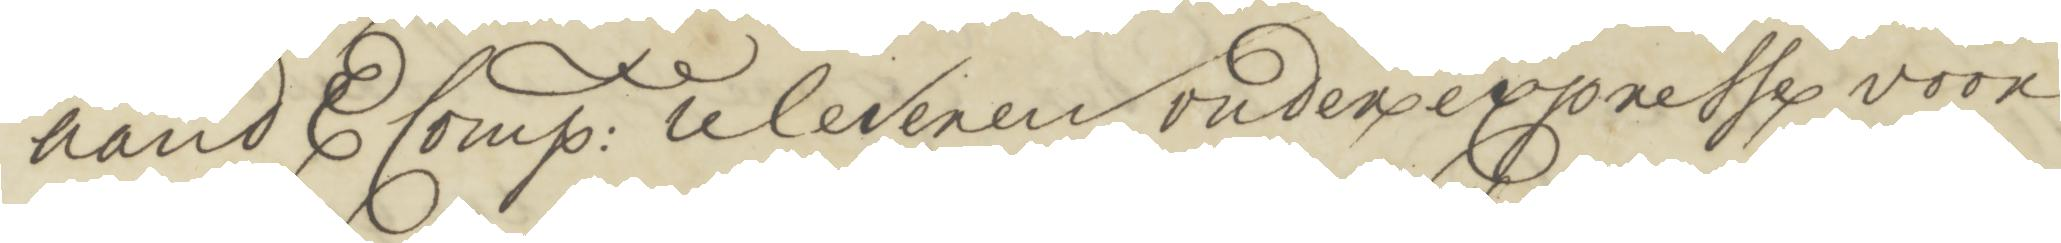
aand E Comp: televeren, onder expresse voor
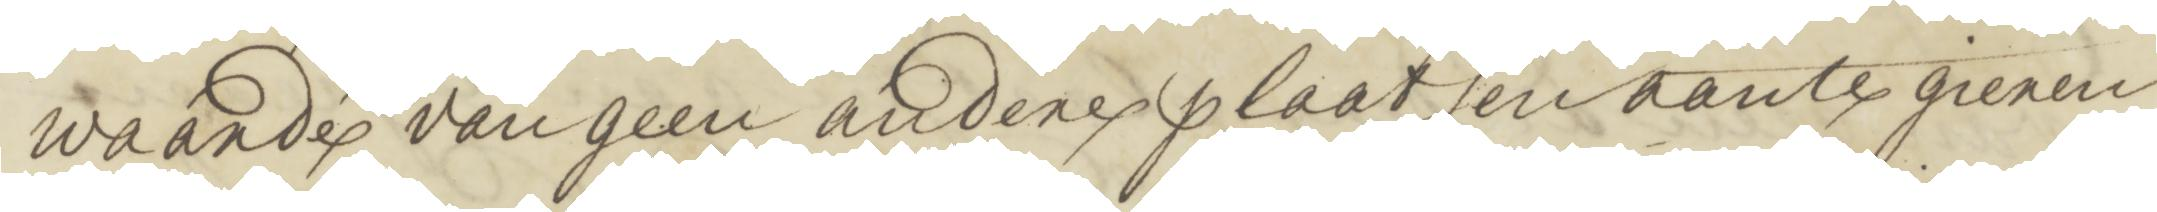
waarde van geen andere plaatsen aante gieren
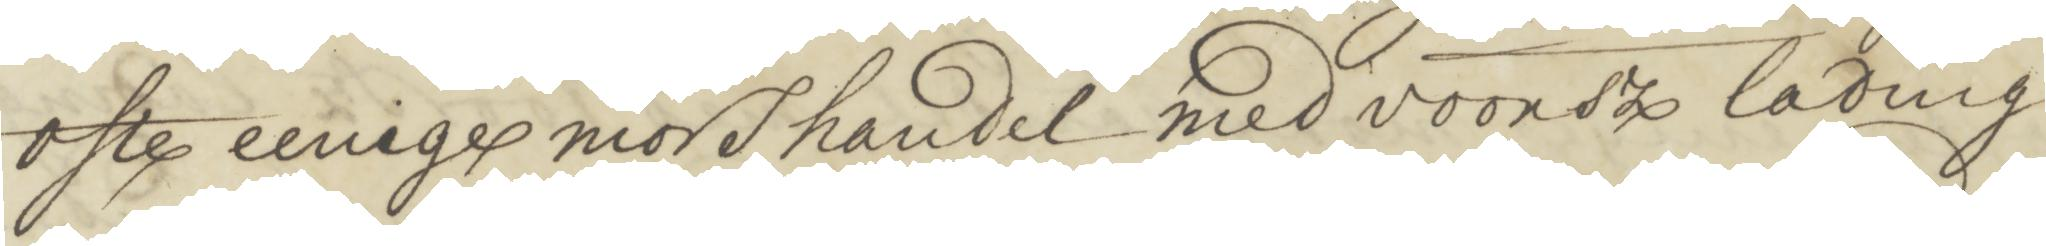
ofte eenige mors handel med voorsz lading
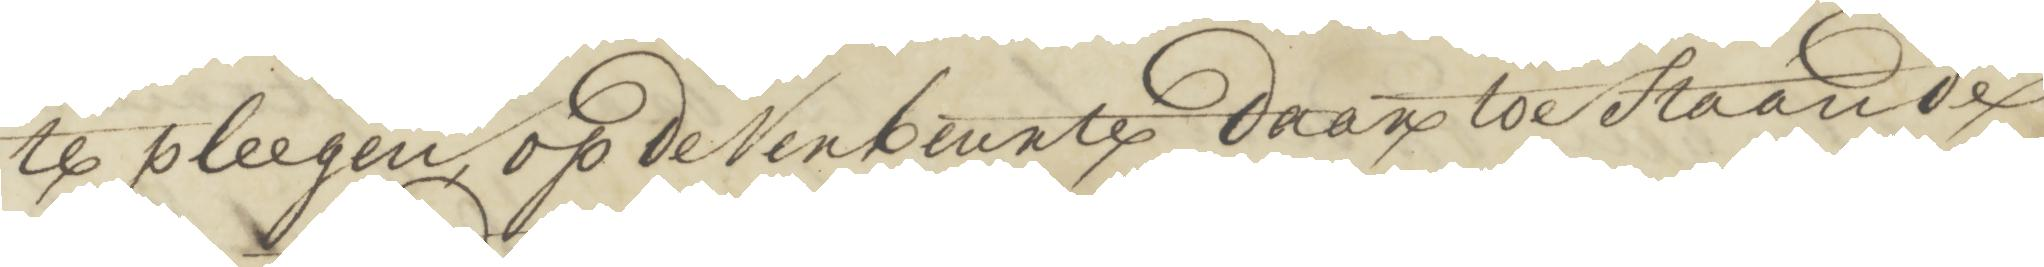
te pleegen, op de verbeurte daar toestaan de
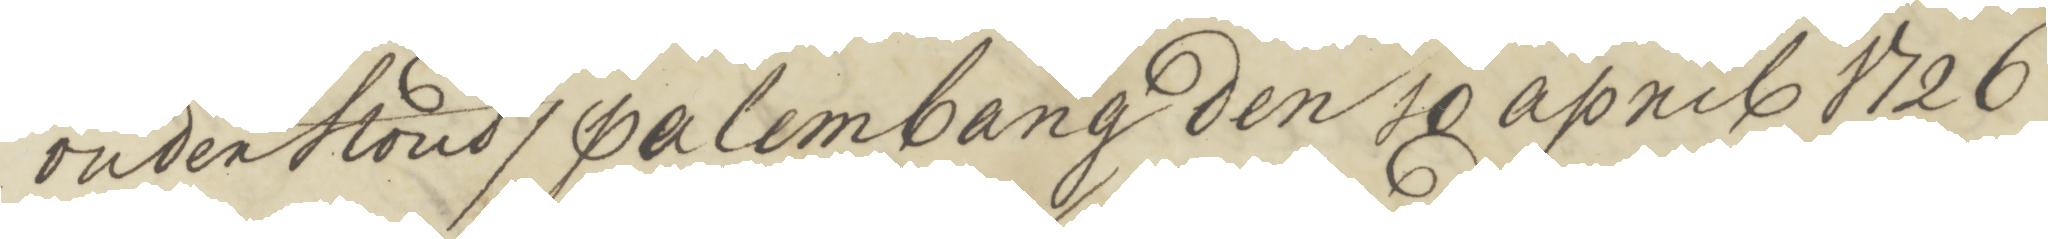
onderstond /palembang den 10 april 1726
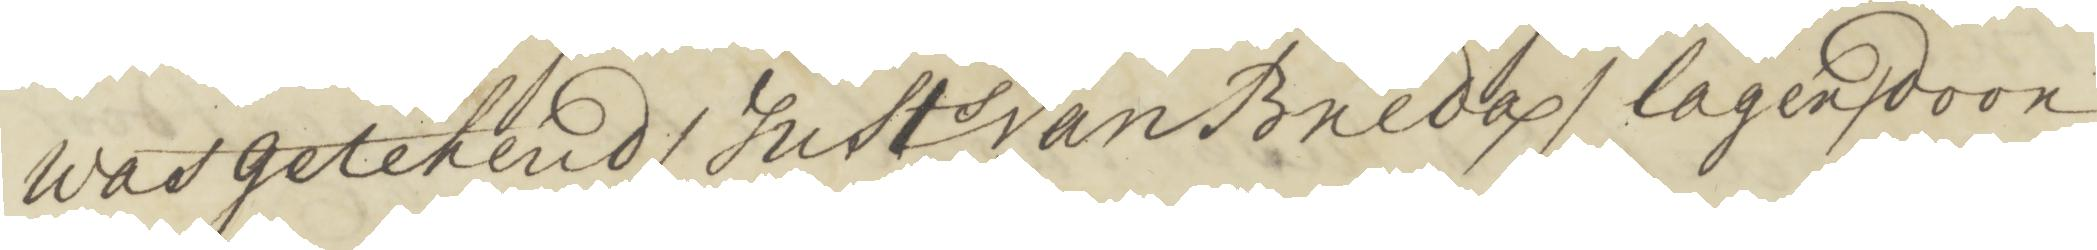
was getekend/ Justs van Breda /lager/ door
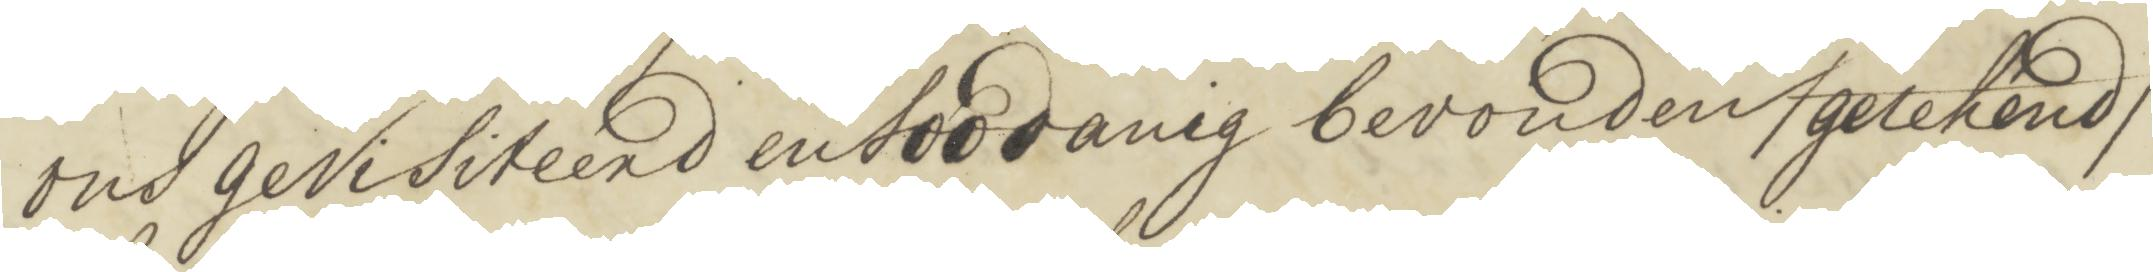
ons gevisiteerd ensoodanig bevonden /getekend/
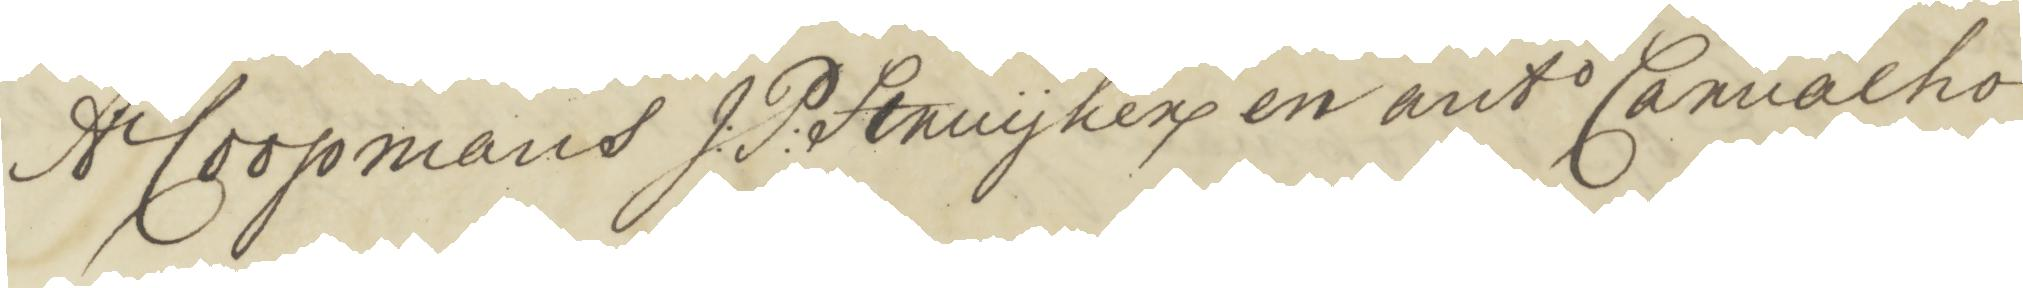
A Coopmans J: P: Struijker en anto Carualho
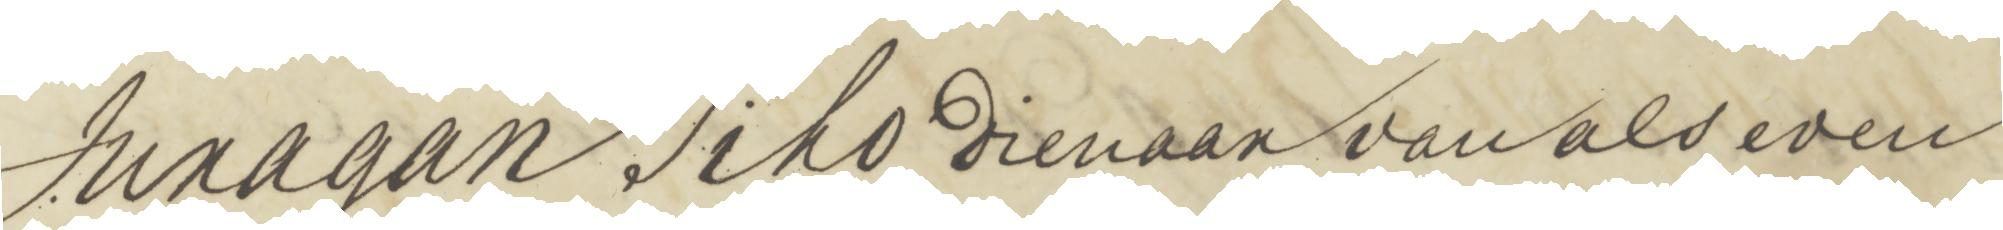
Juragan Piko dienaar van als even
